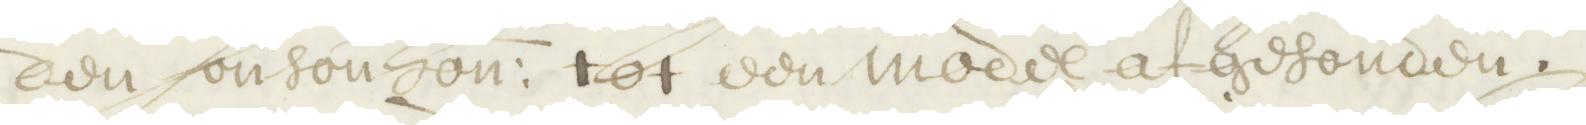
den sousouhon: tot een model afgesonden.
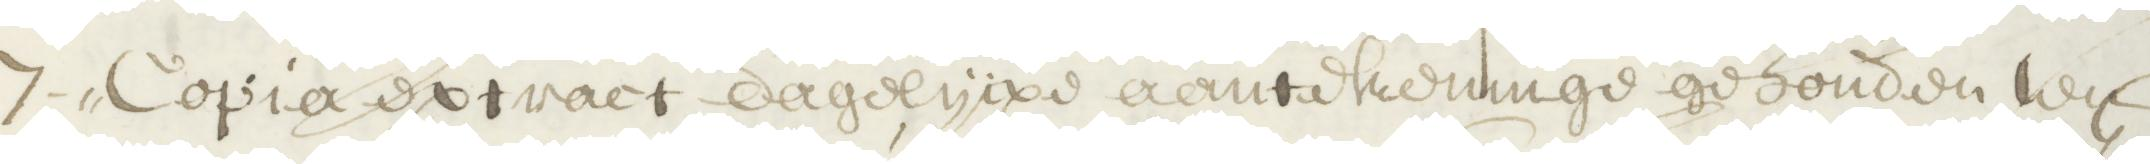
7 „ Copia extract dagelijcxe aantekeninge gesonden ten
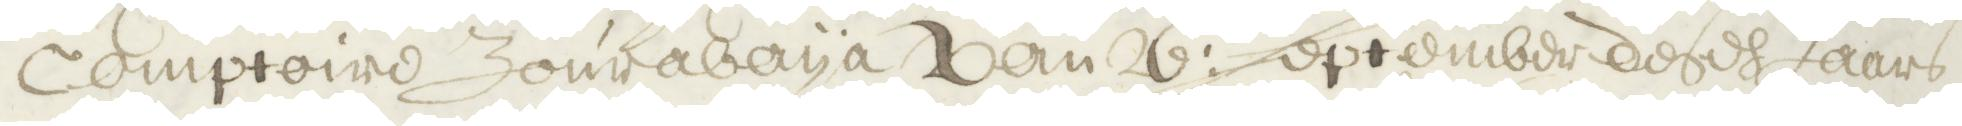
Comptoire zourabaija van 26: September deses Jaars
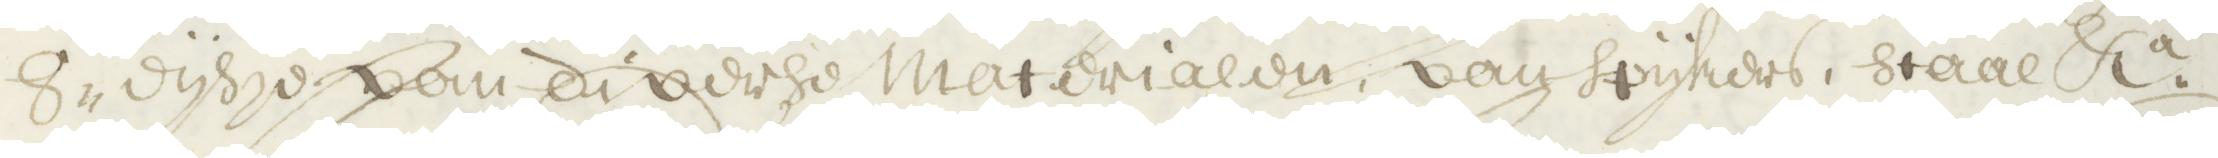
8 „ eijsje van diverse Materialen, van spijkers, staal et„a
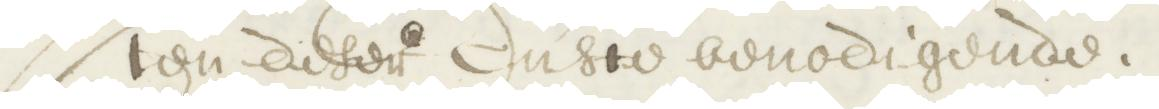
ten deser custe benodigende.
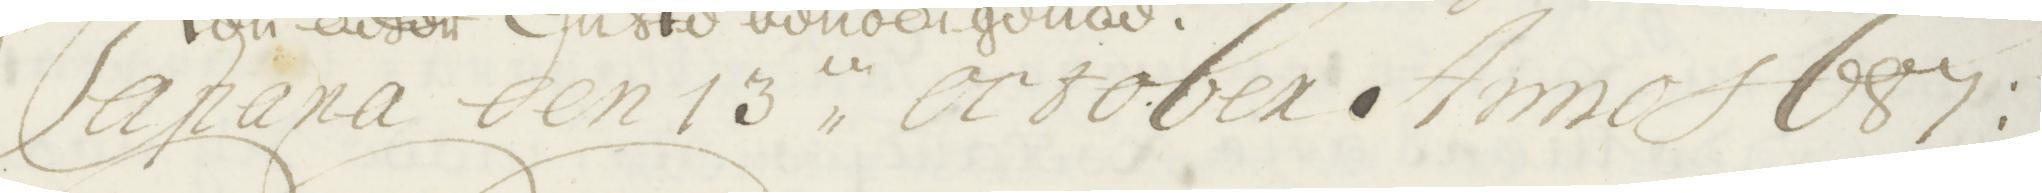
Japara den 13„en October Anno 1687:
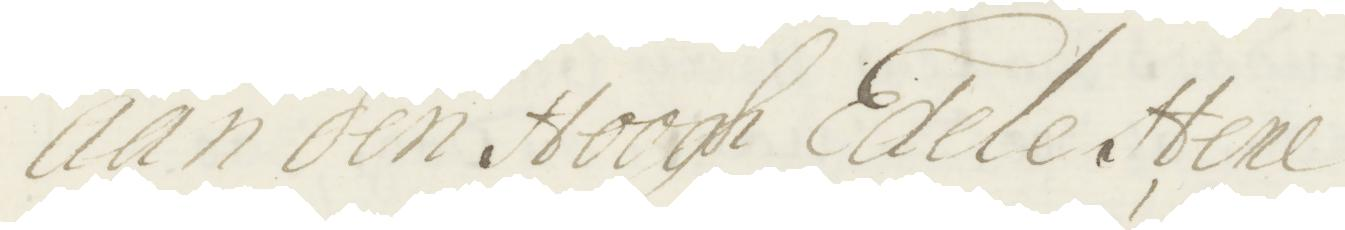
aan den Hoogh Edele Here
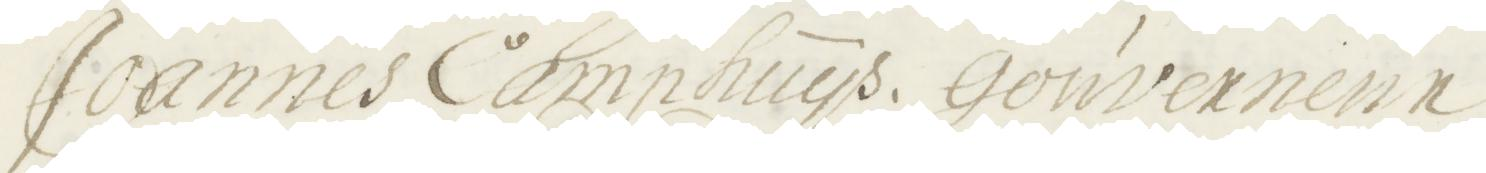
Joannes Camphuijs, gouverneur
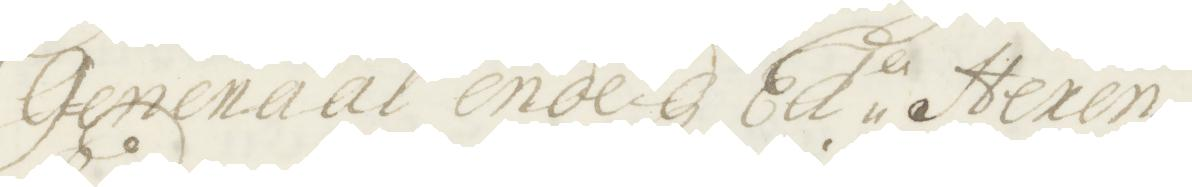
Generaal ende d' Ed„e Heren
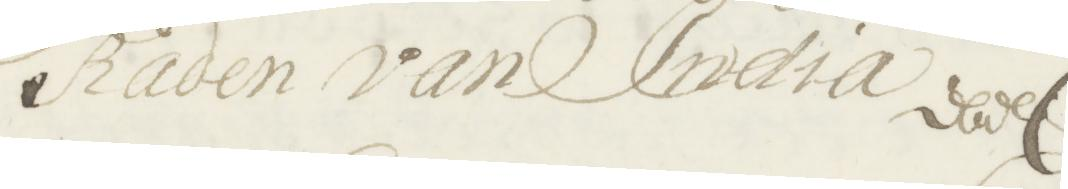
Raden van Jndia wel
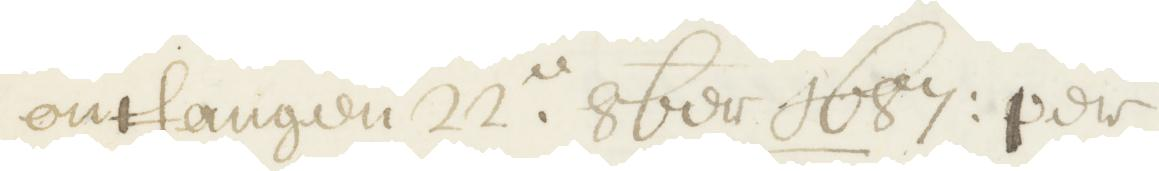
ontfangen 22.e 8ber 1687: per
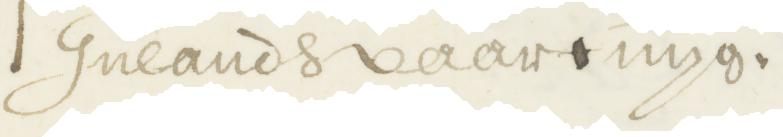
Jnlands vaartuijg.
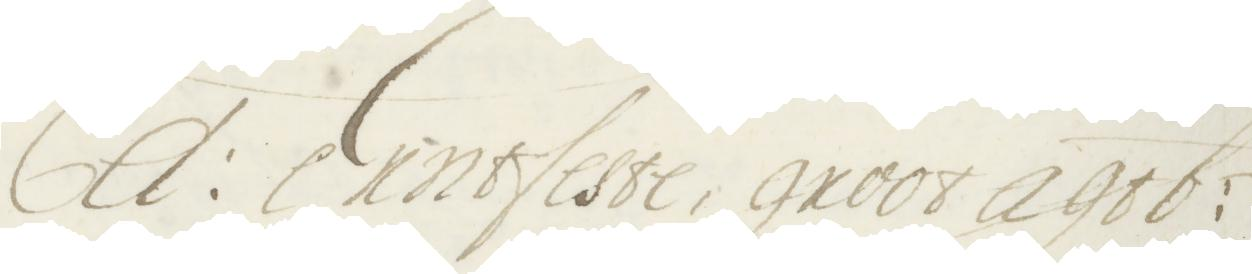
Ed: erntfeste, groot agtb:
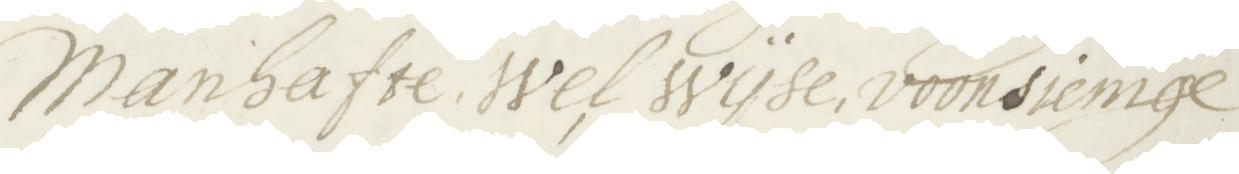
Manhafte wel wijse, voorsienige
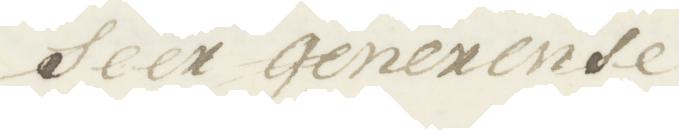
seer genereuse
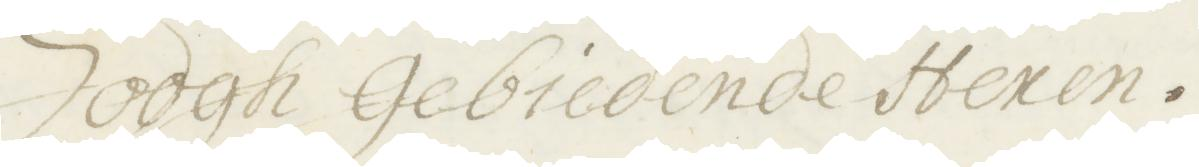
Hoogh gebiedende Heren.
